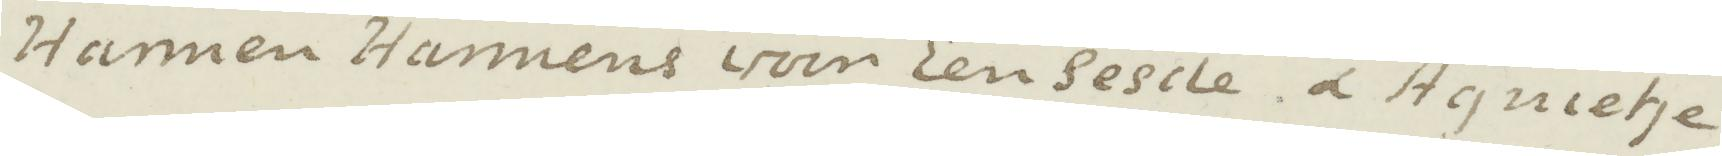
Harmen Harmens voor Een sesde & Agnietje
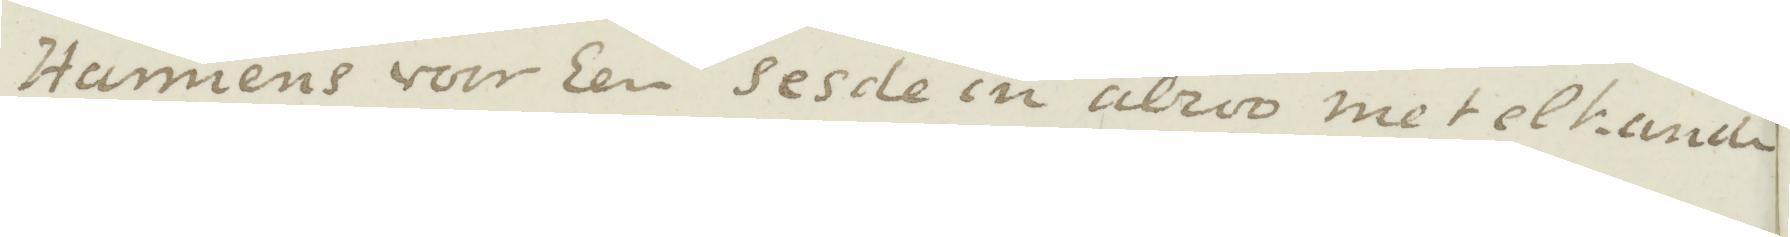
Harmens voor Een sesde en alzoo met elkande
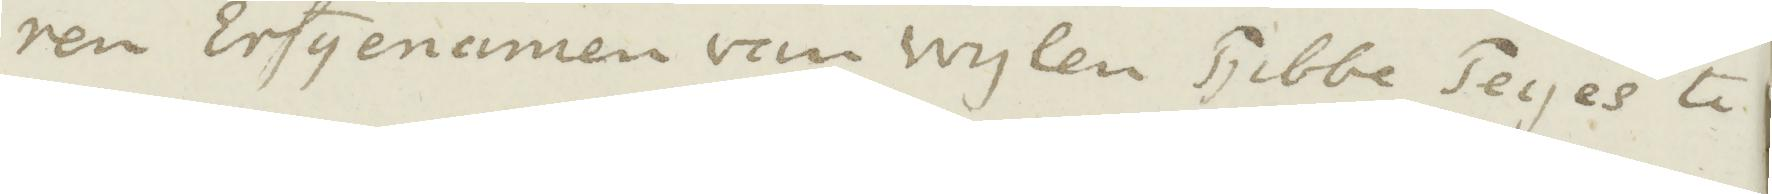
ren Erfgenamen van wylen Tjibbe Teyes te
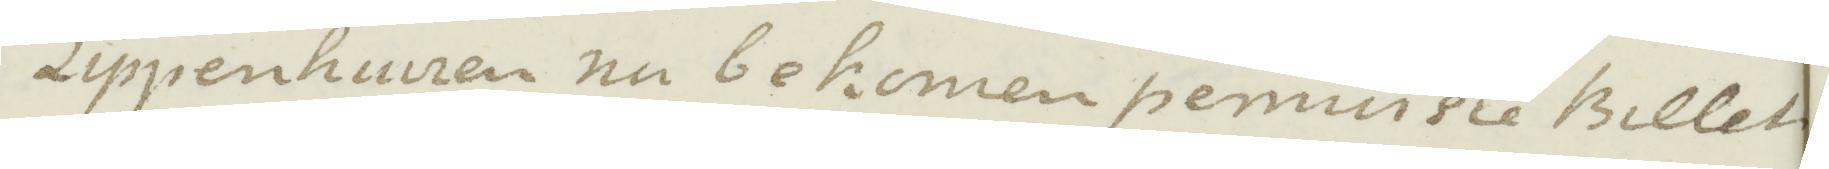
Lippenhuizen na bekomen permissie Billet
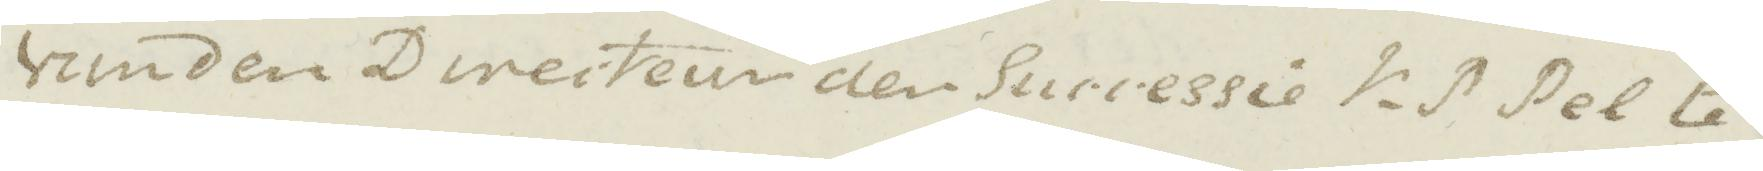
van den Directeur der Successie K P Pel te
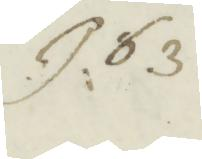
9:63
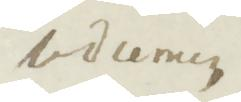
v diemen
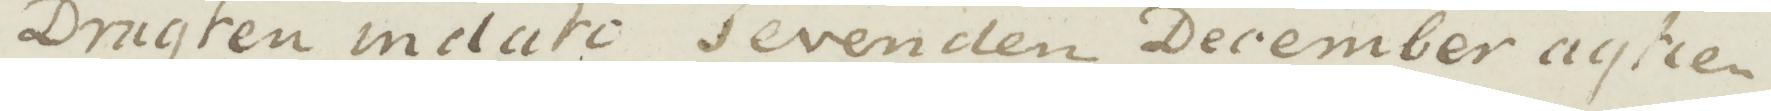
Dragten in dato sevenden December agtien
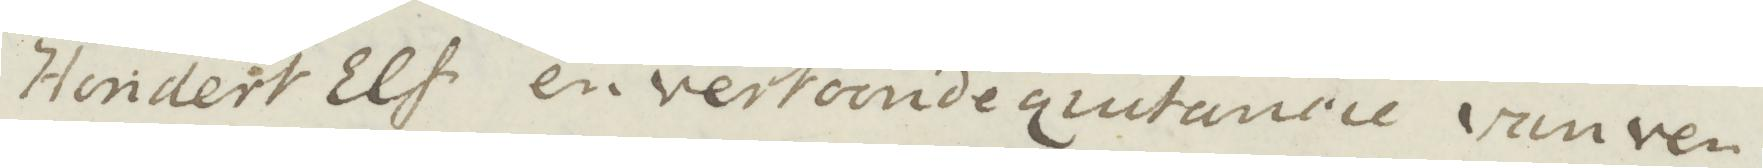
Hondert Elf en vertoonde quitancie van ver
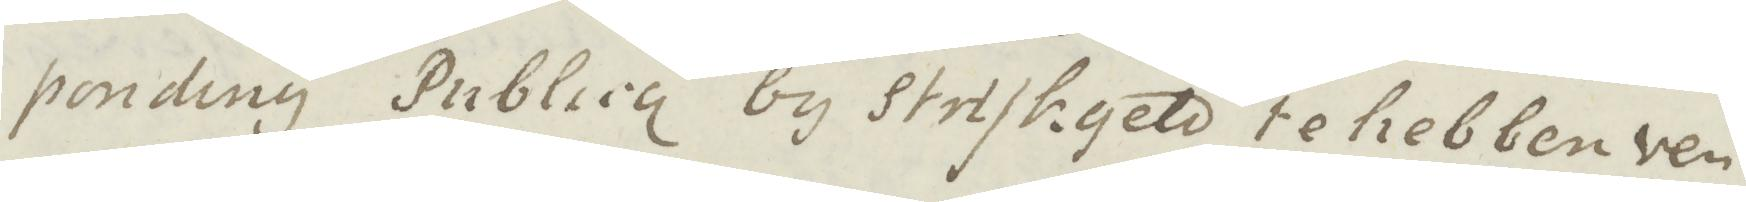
ponding Publicq by strykgeld te hebben ver
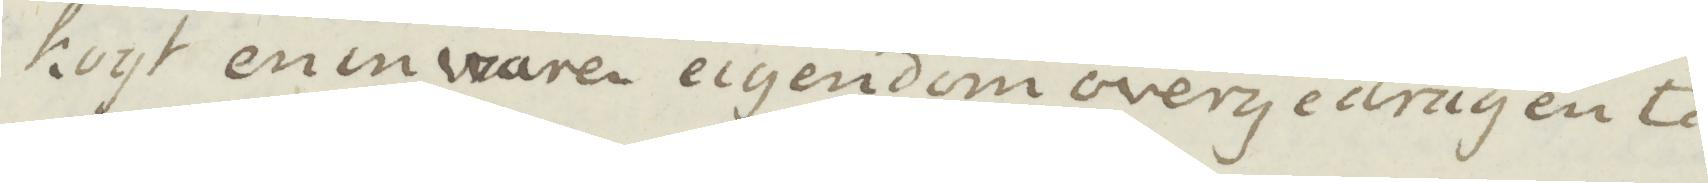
kogt en in waren eigendom overgedragen te
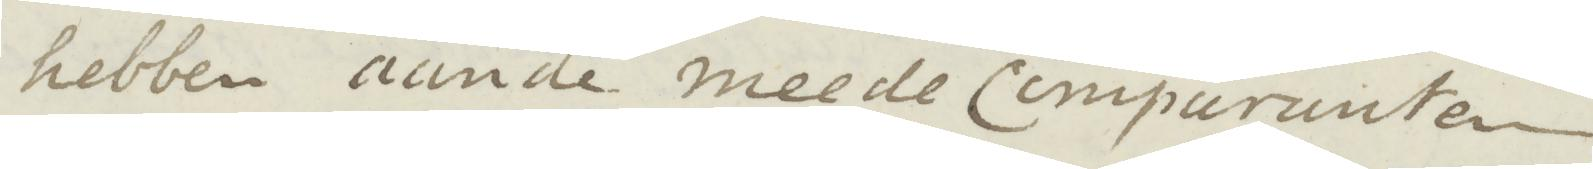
hebben aan de meede Comparanten
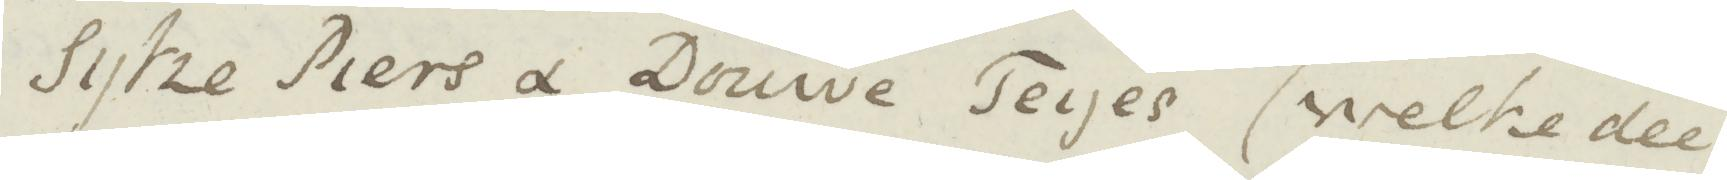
Sytze Piers & Douwe Teyes (welke dee
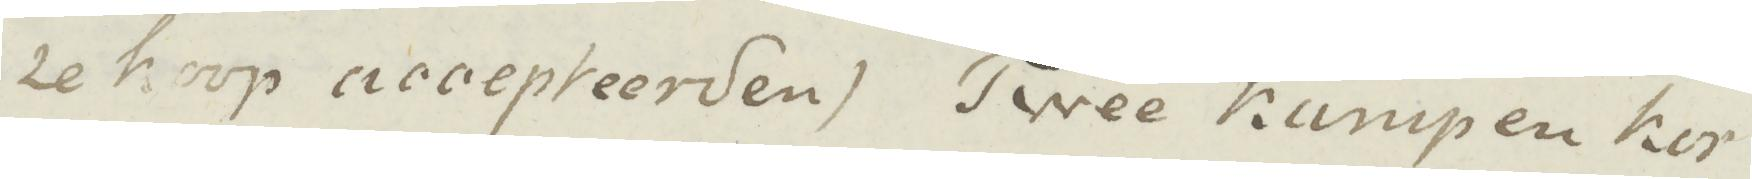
ze koop accepteerden) Twee kampen kos
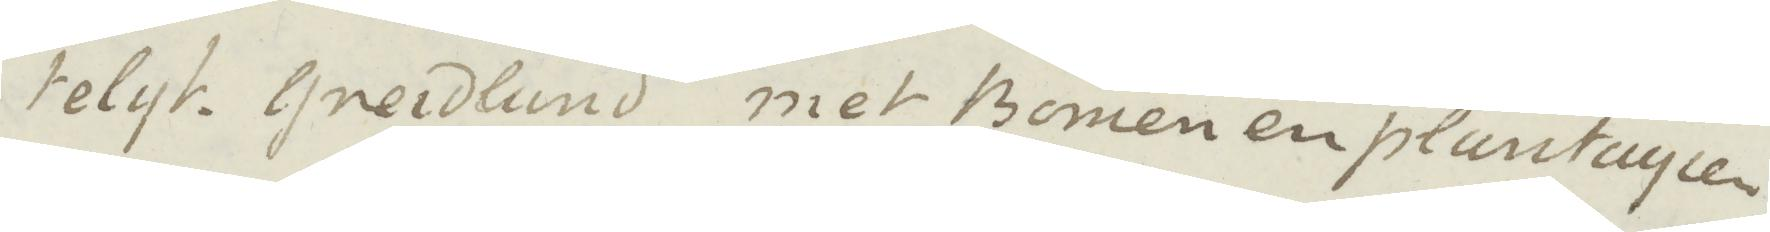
telyk Greidland met Bomen en plantagien
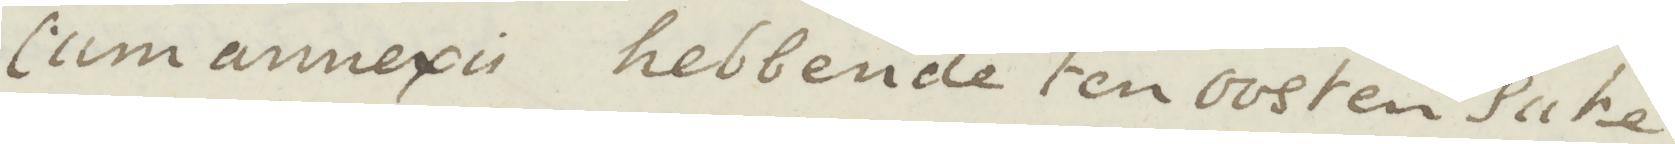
cum annexis hebbende ten oosten sake
